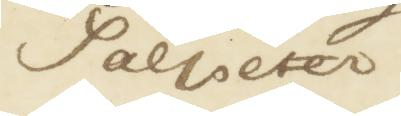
Salperer
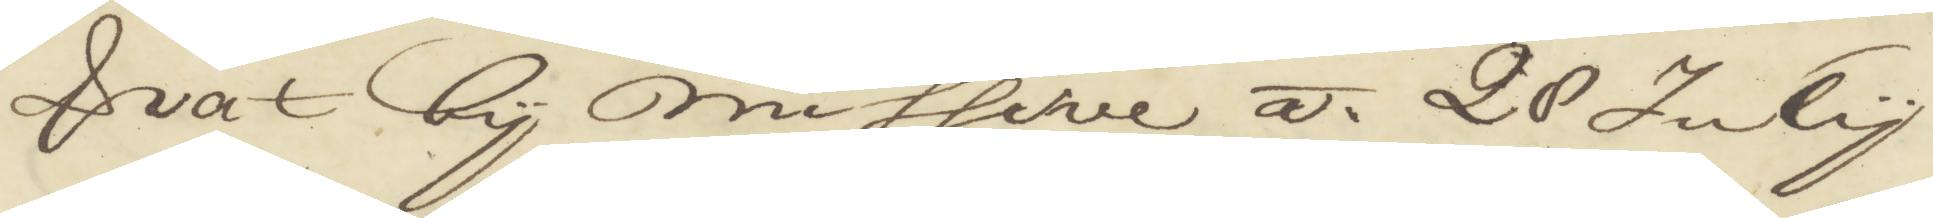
Vervat bij missive /a: 28 Iulij
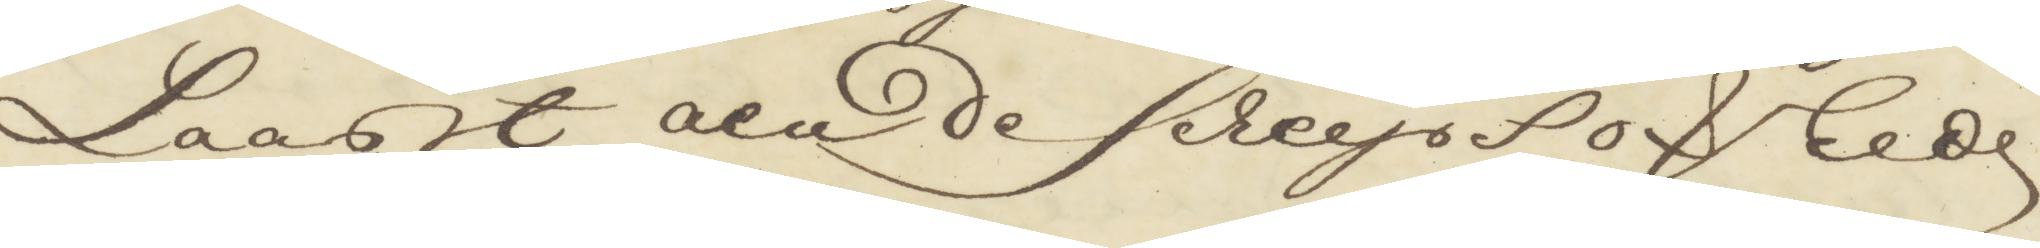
Laastl aen de Scheepsoverheden
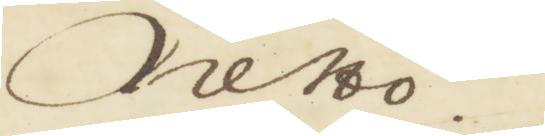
netto
